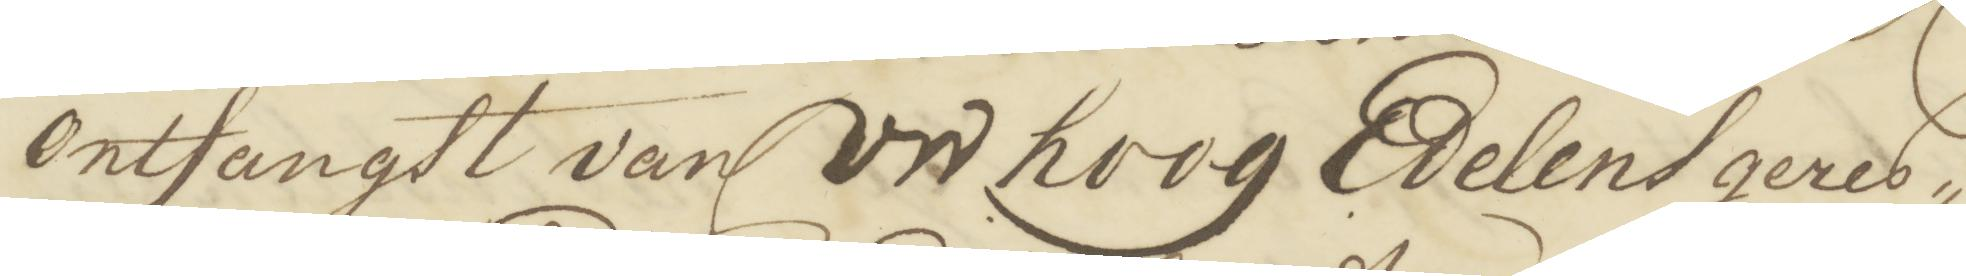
ontfangst van Uw hoog Edelens geres„
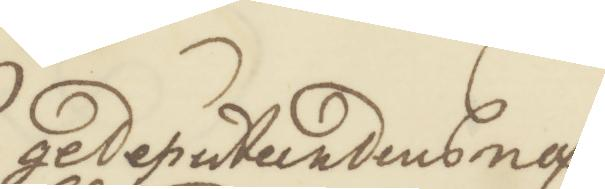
gedeputeerdens na
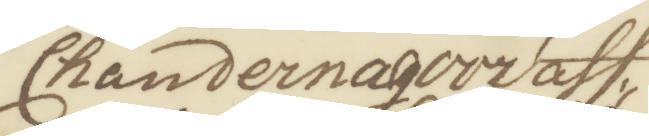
Chandernagoor aff„
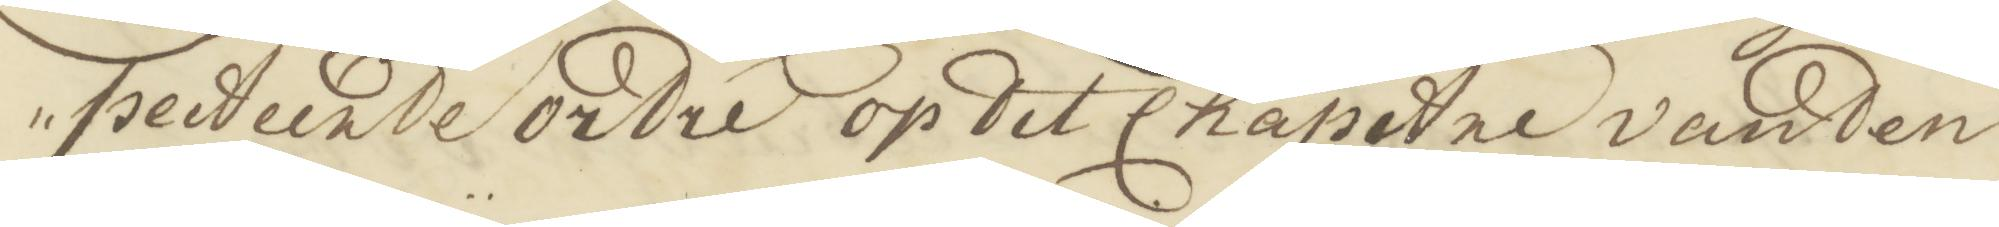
„pecteerde ordre op dit Chapitre van den
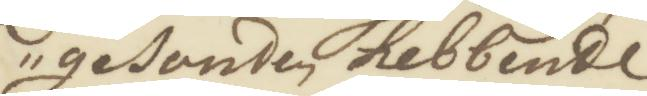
„gesonden hebbende
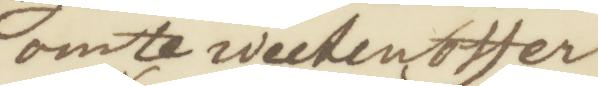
om te weeten off er
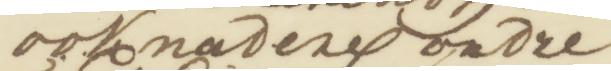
ook nadere ordre
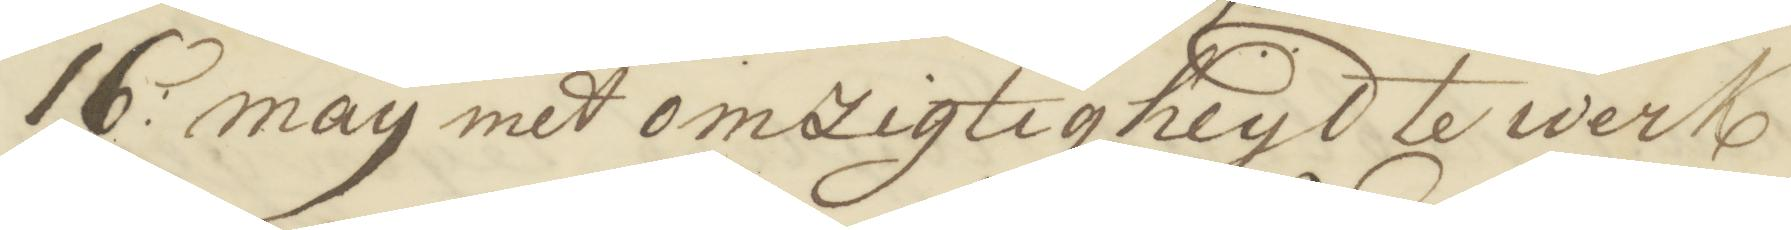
16:' maij met omzigtigheijd te werk
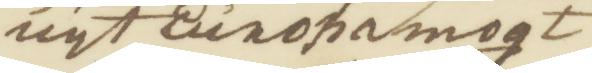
uijt Europa mogt
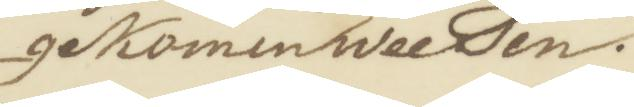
gekomen weesen.
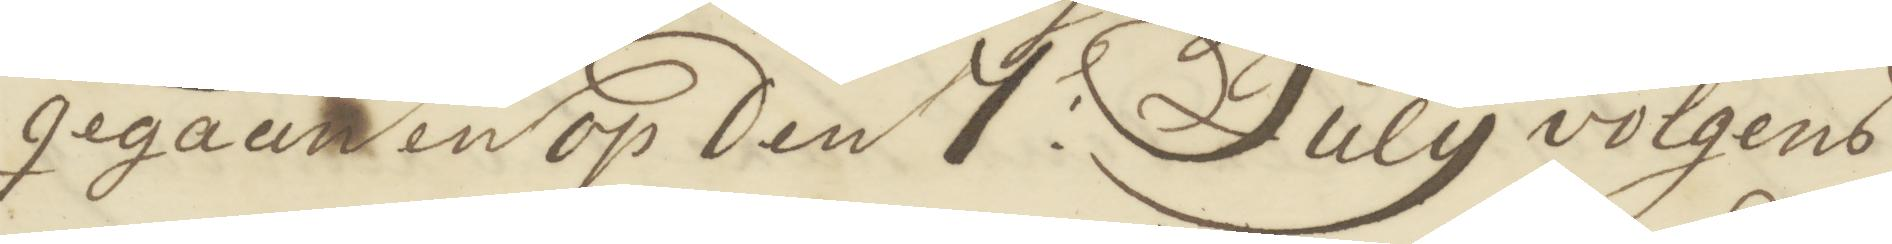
gegaan en op den 7:' Iulij volgens
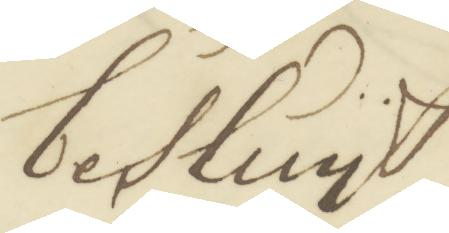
besluijt.
